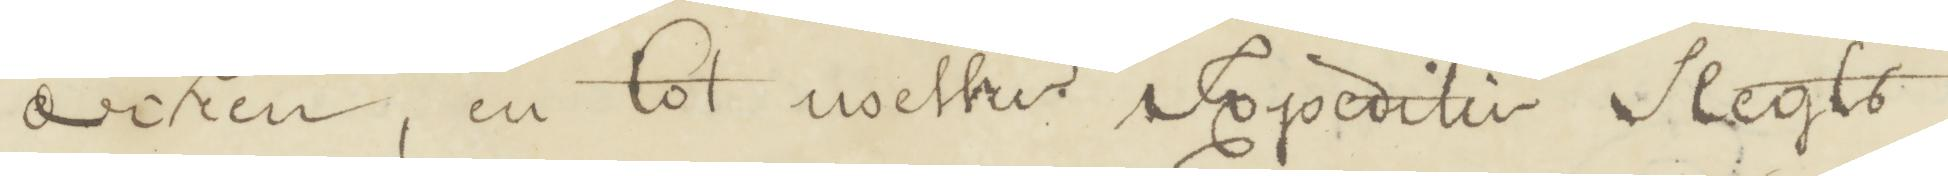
decken, en tot welke Expeditie slegts
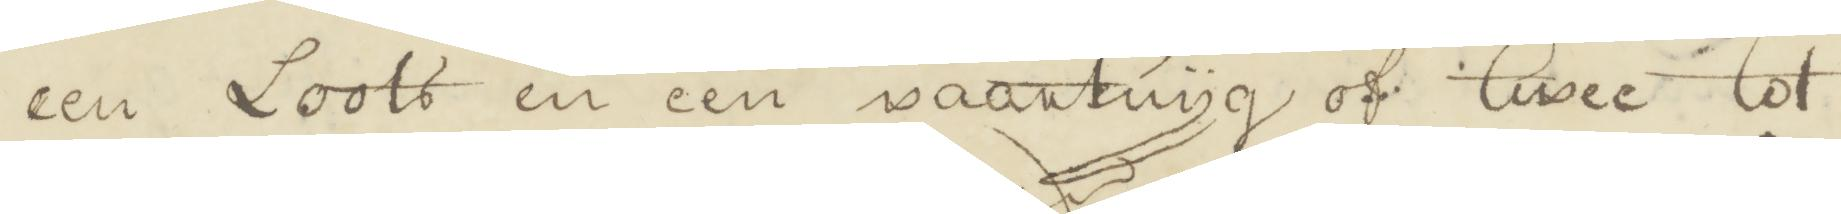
een Loots en een vaartuijg of twee tot
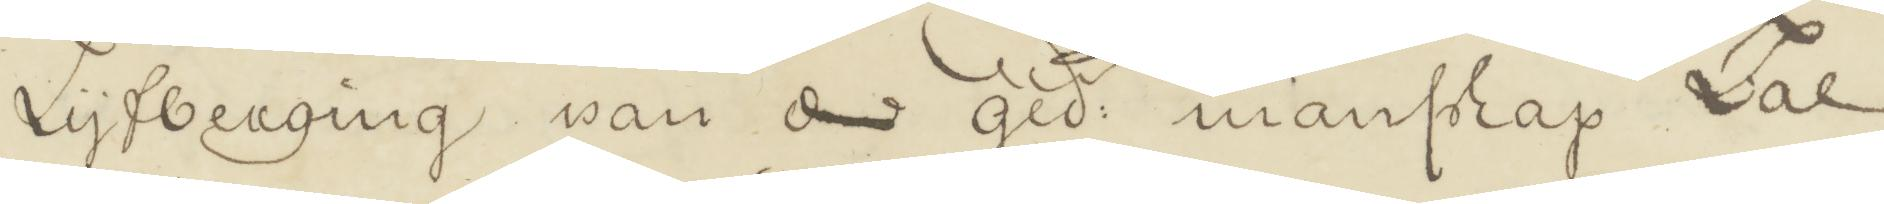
Lijfberging van de ged: manschap zal
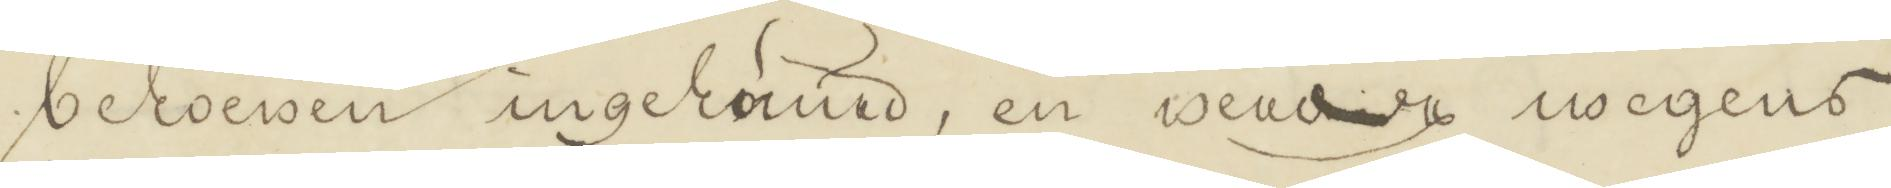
behoeven ingehuurd, en verder wegens
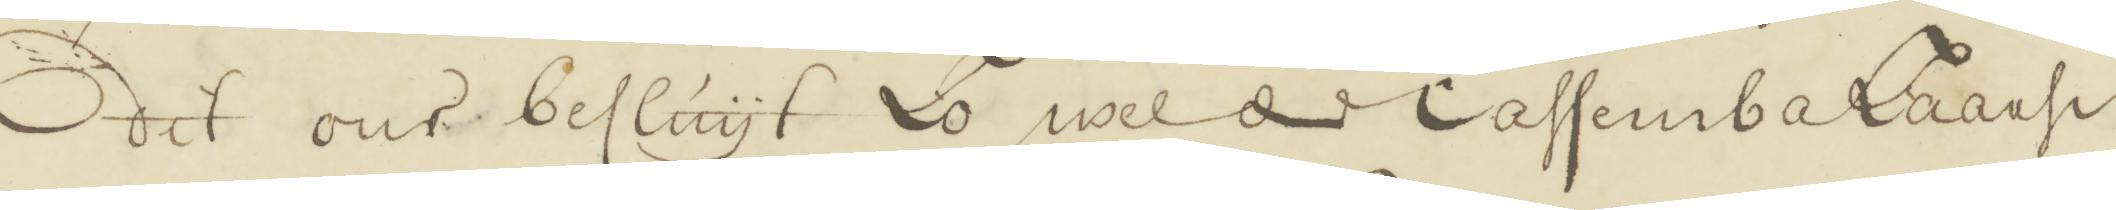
dit ons besluijt zo wel de Cassembazaarse
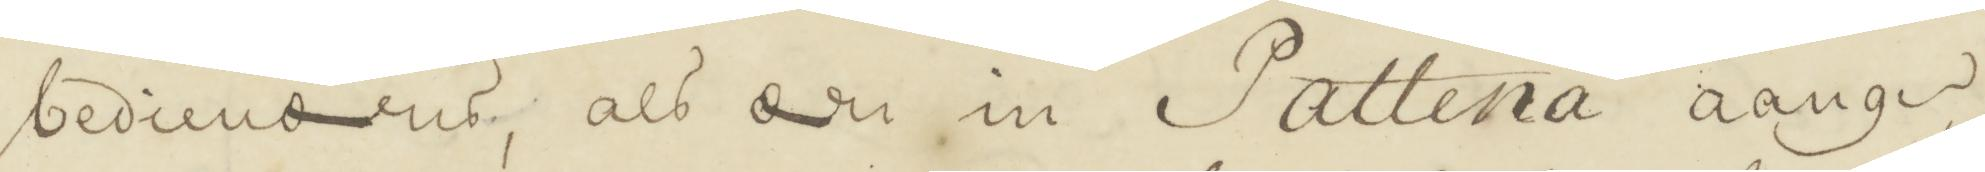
bediendens; als den in Pattena aange
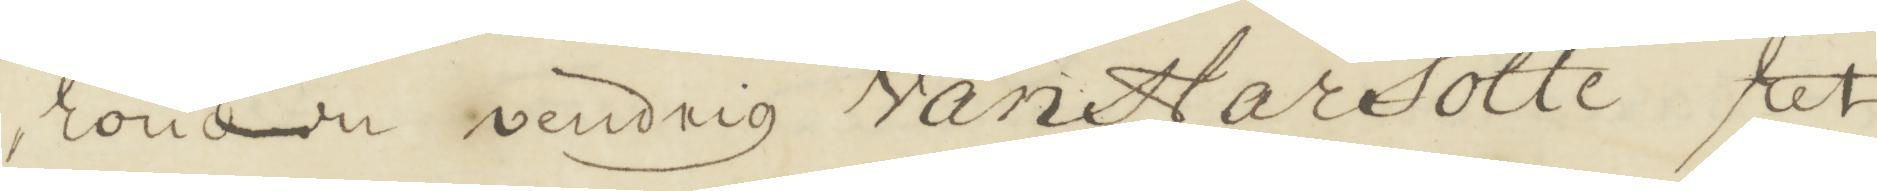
„houden vendrig van Harsolte het
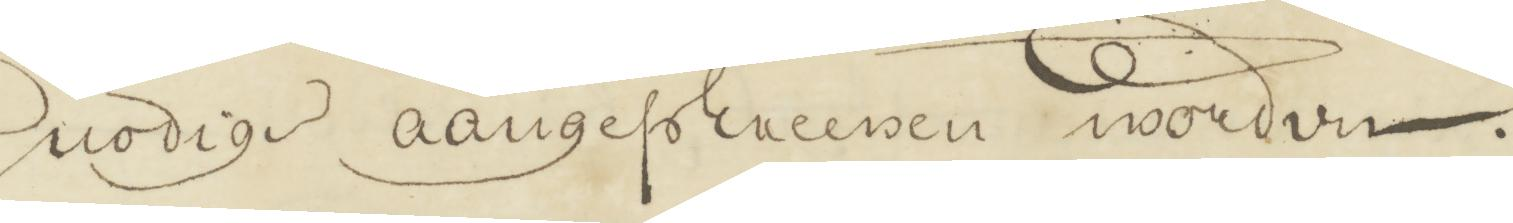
nodige aangeschreeven worden.
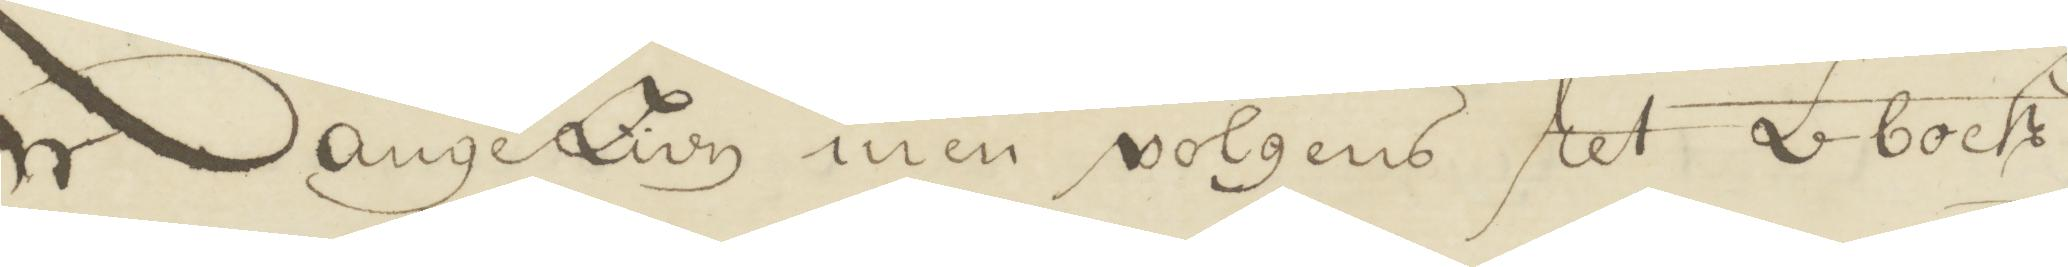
Aangezien men volgens het te boek
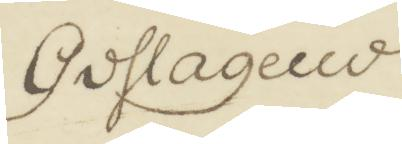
Geslagene
